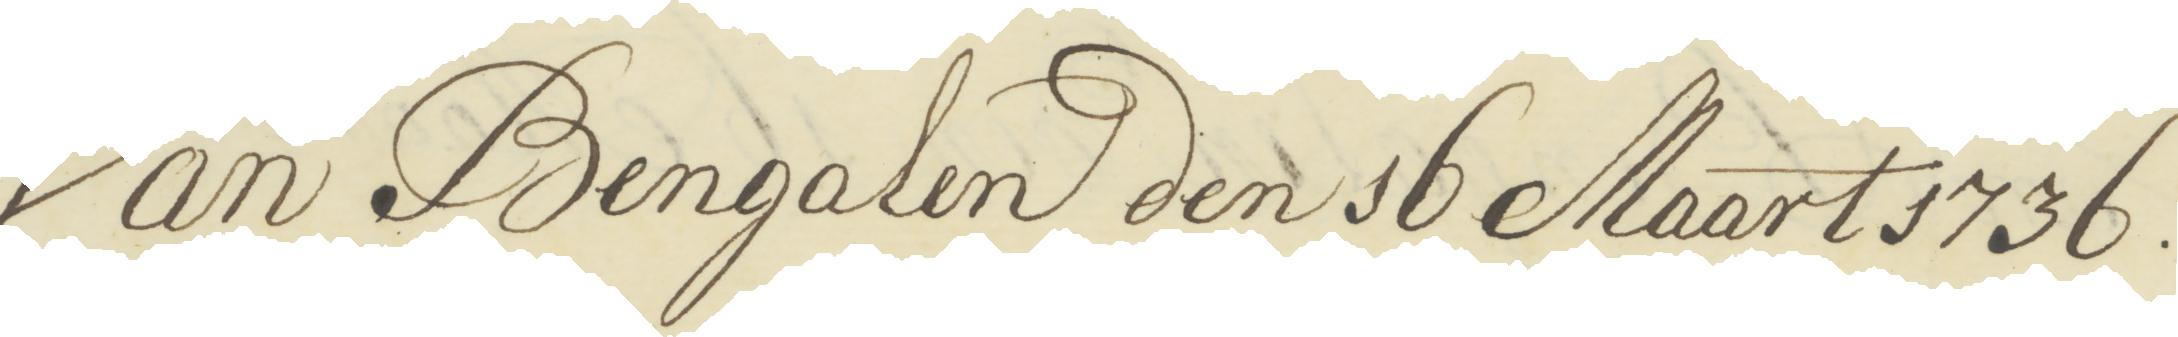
Van Bengalen den 16 Maart 1736.
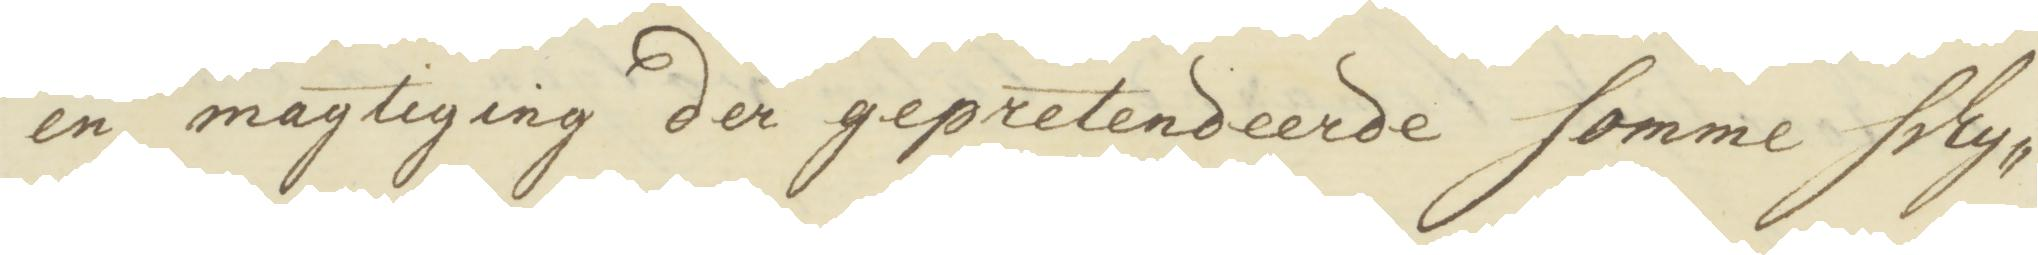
en magtiging der gepretendeerde somme schy„
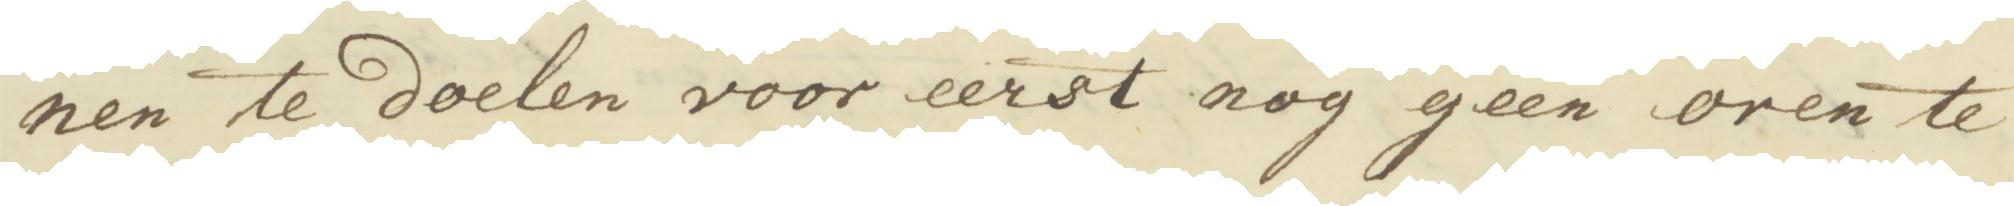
nen te doelen voor eerst nog geen oren te
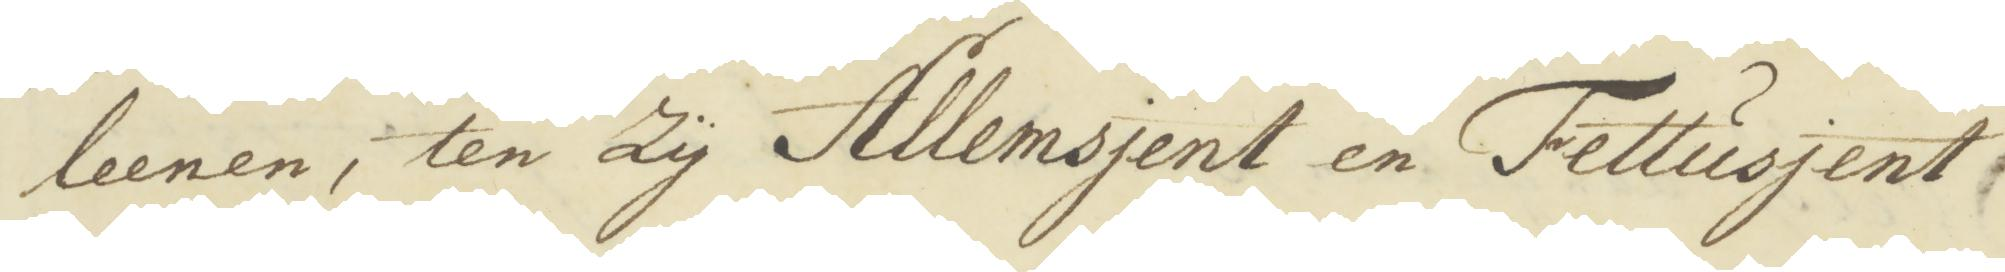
leenen; ten zij Allemsjent en Fettusjent
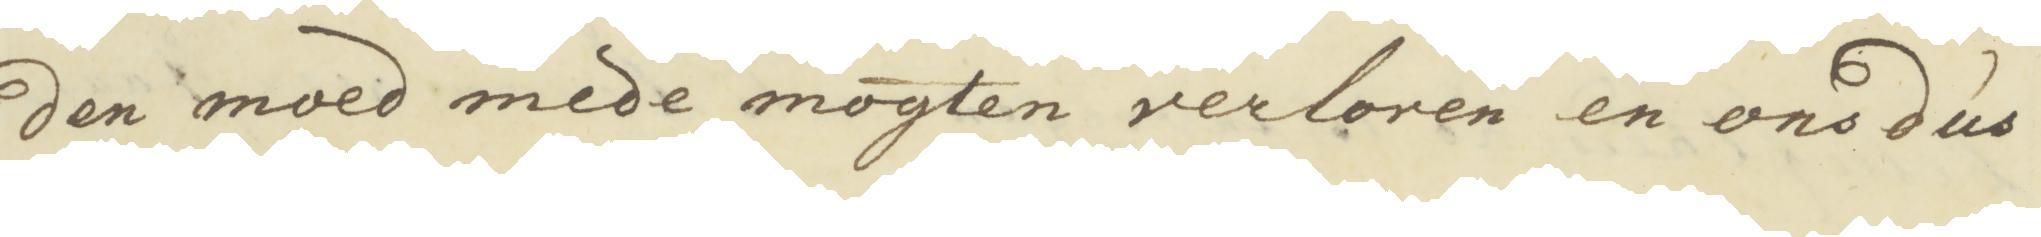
den moed mede mogten verloren en ons dus
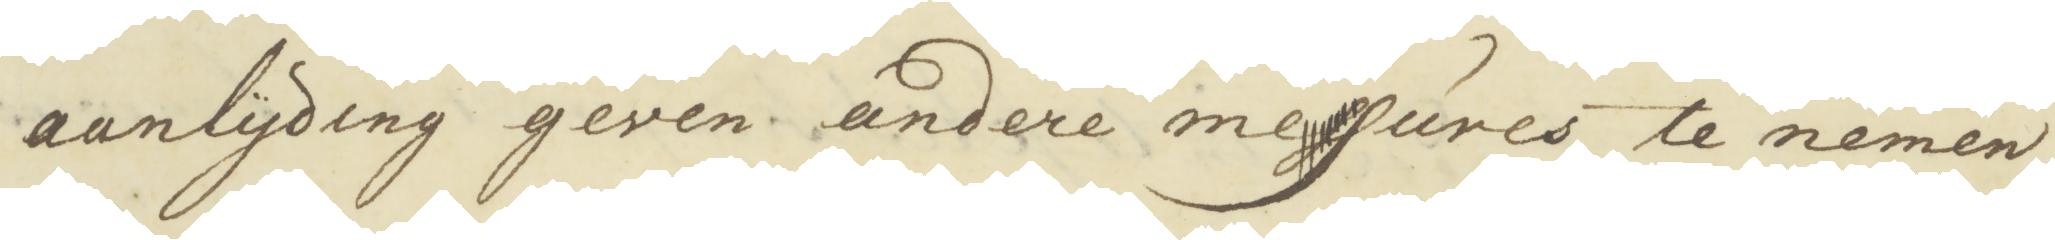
aanlijding geven andere messures te nemen
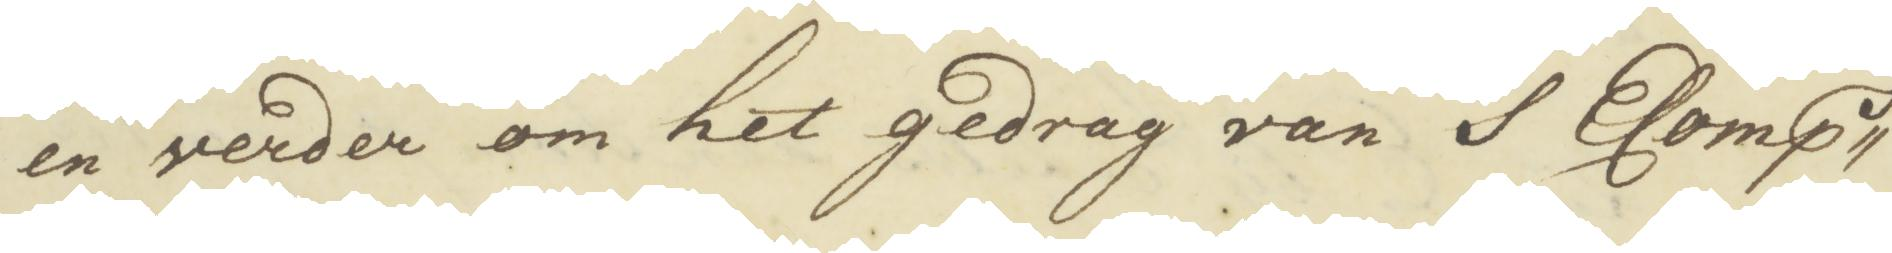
en verder om het gedrag van ’s EComp„
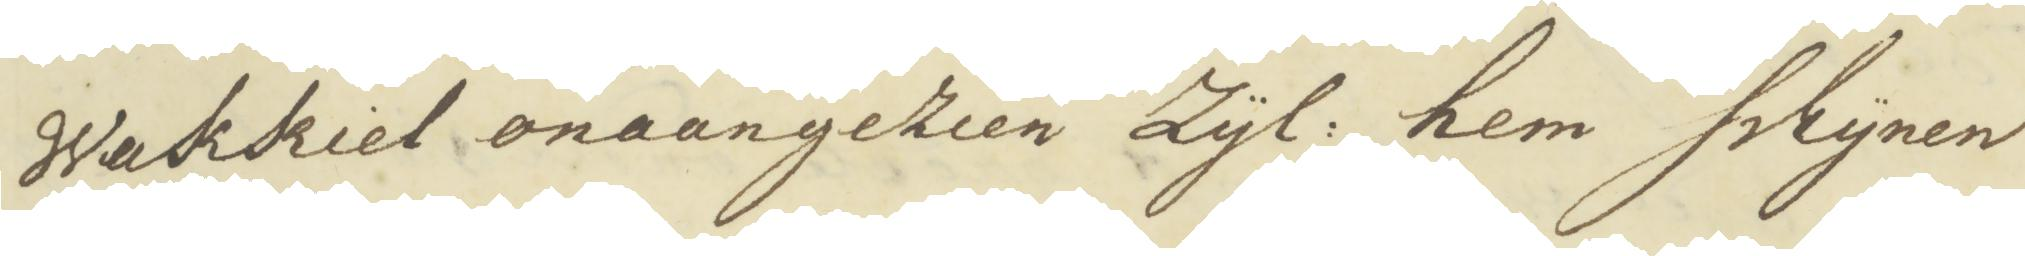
wakkiel onaangezien zijl: hem schijnen
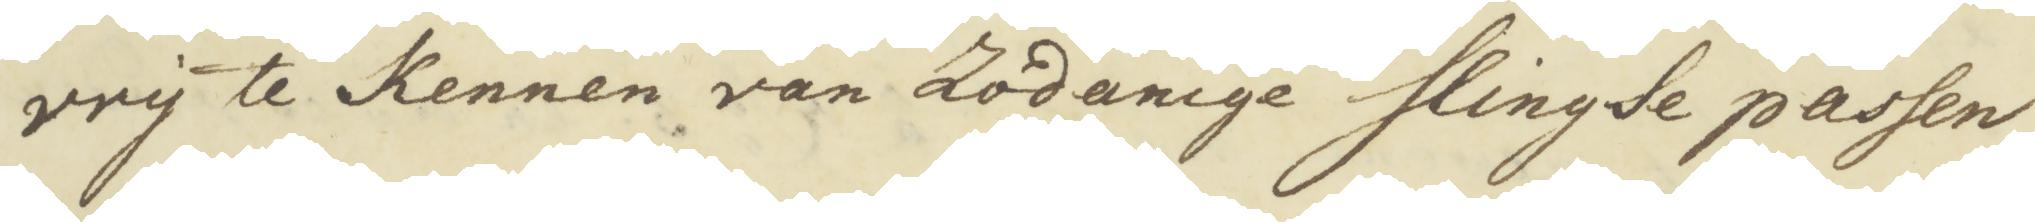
vrij te kennen van zodanige slingse passen
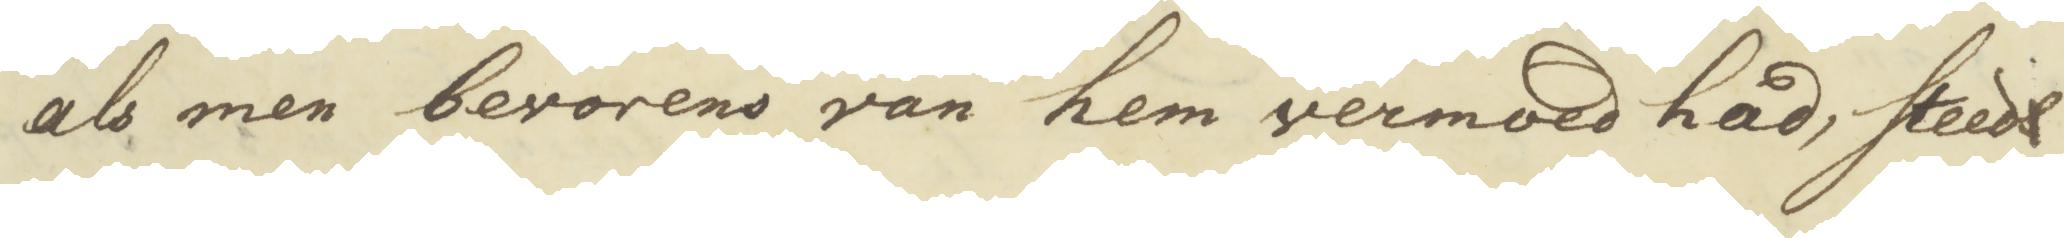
als men bevorens van hem vermoed had, steeds
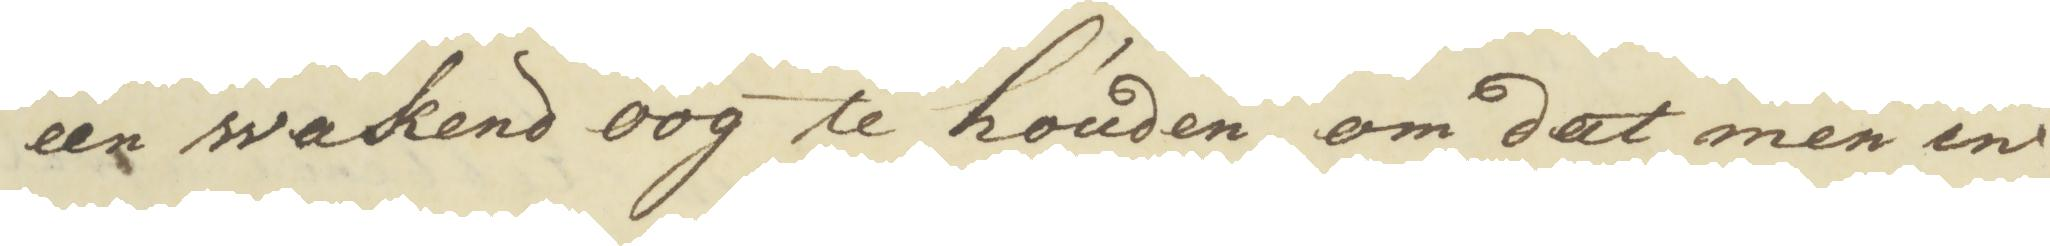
een wakend oog te houden om dat men in
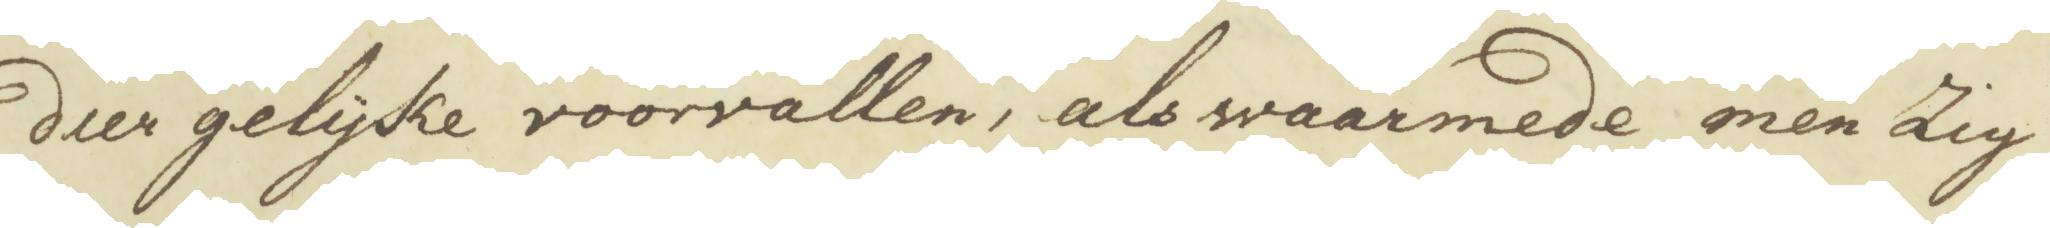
dier gelijke voorvallen, als waarmede men zig
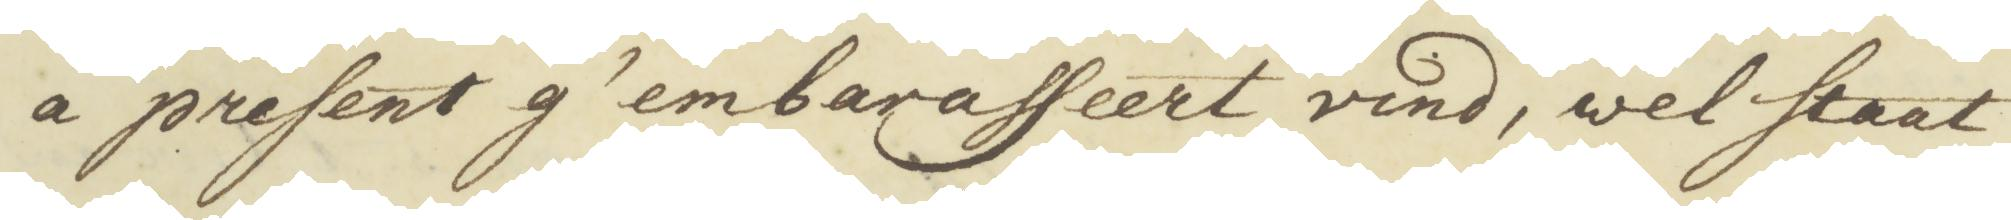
a present g’embarasseert vind, wel staat
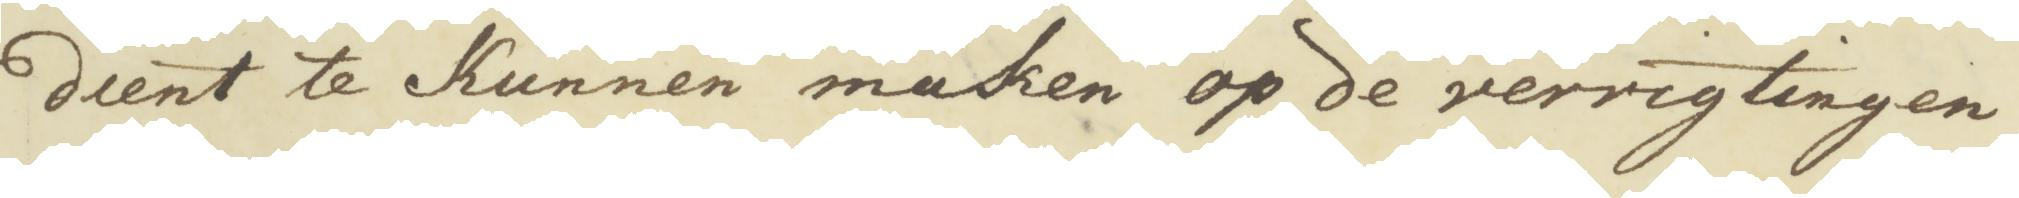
dient te kunnen maken op de verrigtingen
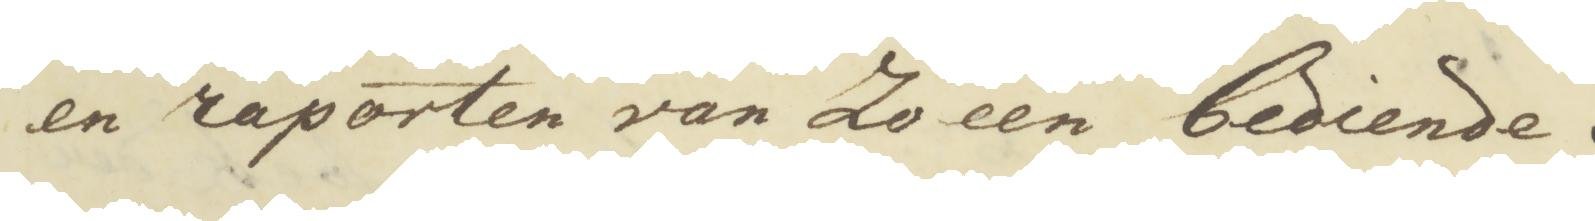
en raporten van zo een bediende
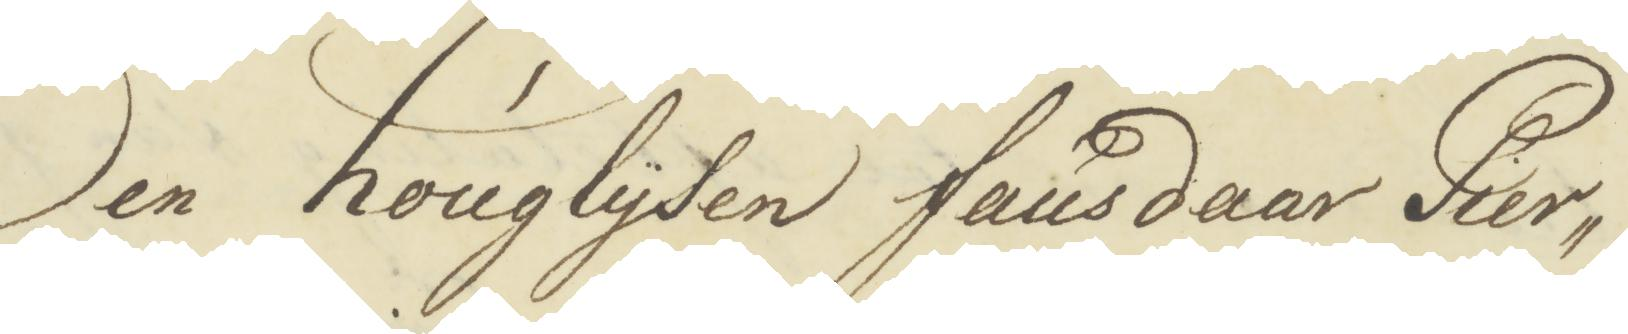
en houglijsen faus daar Pier„
